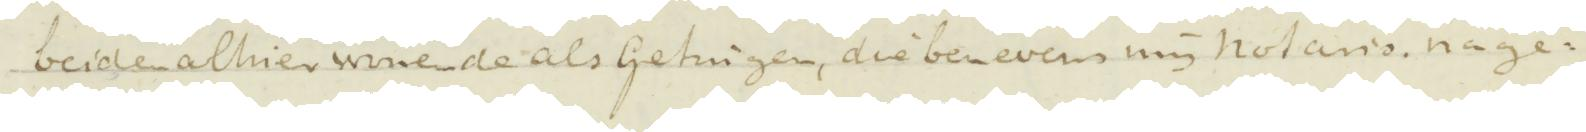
beiden alhier wonende als getuigen, die benevens mij notaris nage„
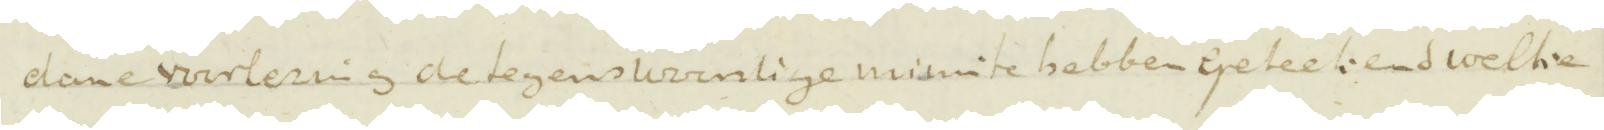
dane voorlezing de tegenswoordige minute hebben geteekend welke
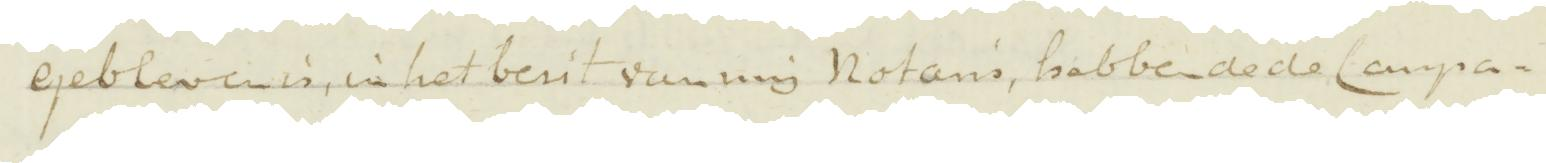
gebleven is, in het bezit van mij Notaris, hebben de de Compa=
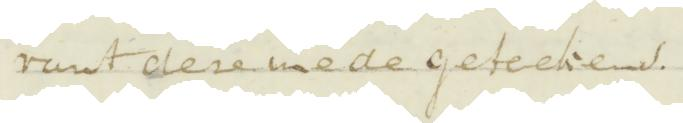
rant deze mede geteekend.
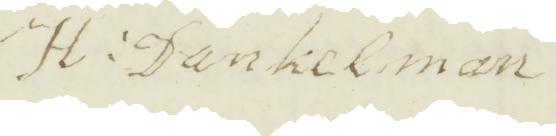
H: Dankelman
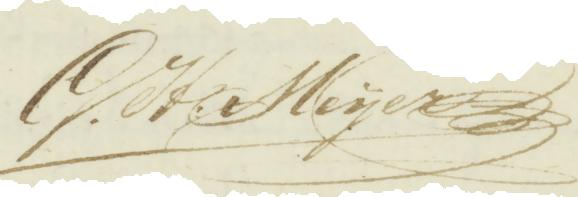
G. H: Meijer.
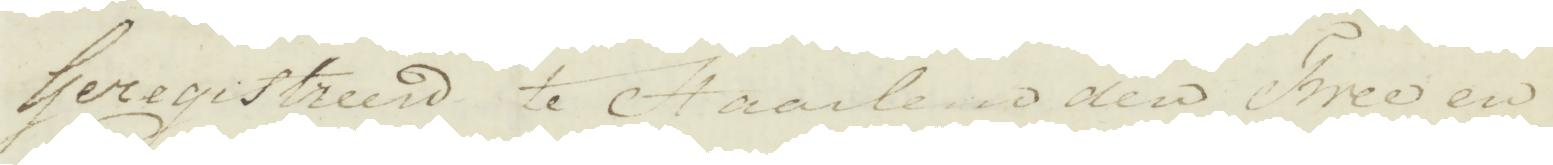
Geregistreerd te Haarlem den Twee en
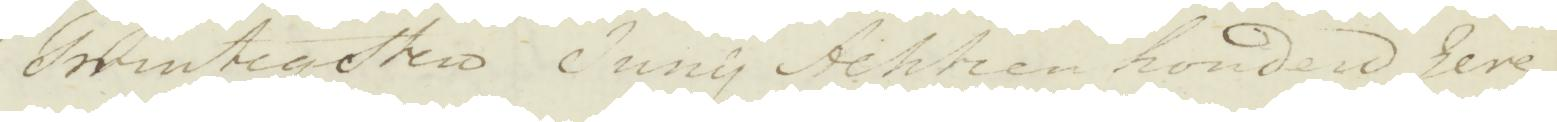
Twintigsten Junij Achtien honderd Zeve
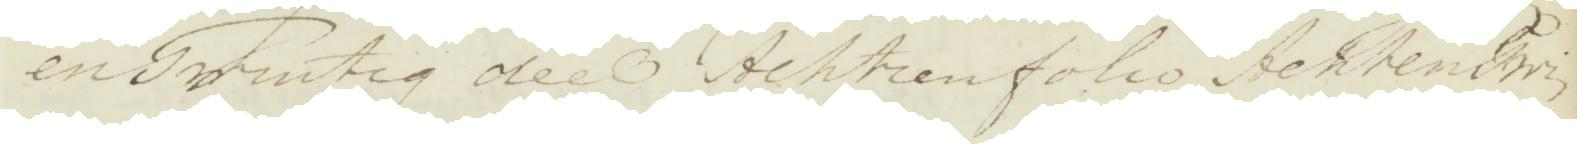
en Twintig deel Achtien folio Achtentwin
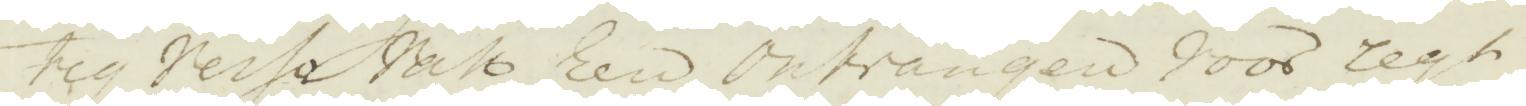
tig verso vak Een ontvangen voor regt
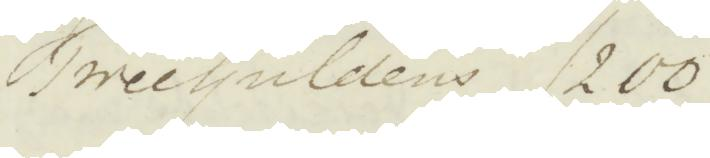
Twee guldens ƒ2 00
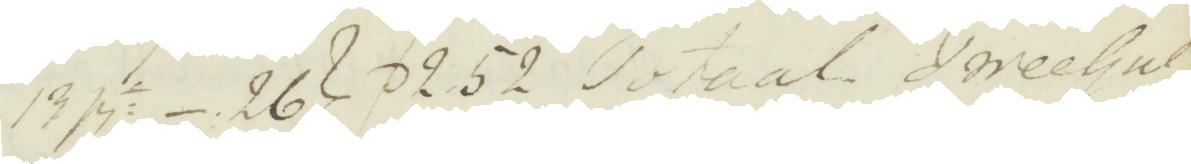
13 pC=t - . 26 ƒ2,52 Totaal Twee Gul
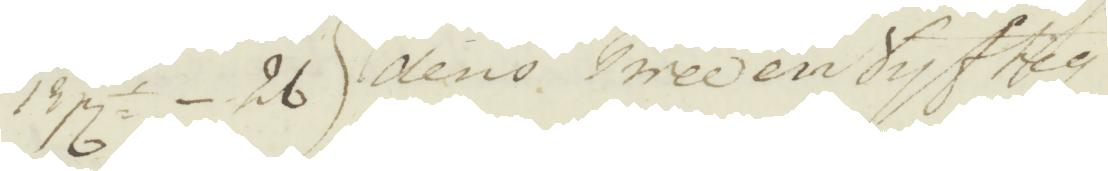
13 pC=t - . 26 dens Twee en Vijftig
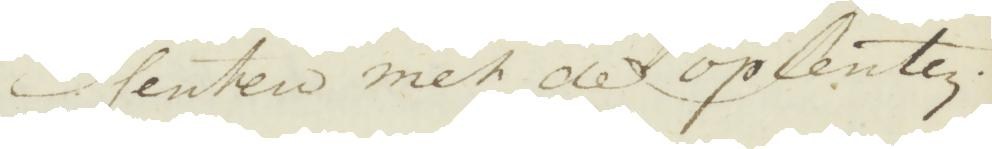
Centen met de opcenten.
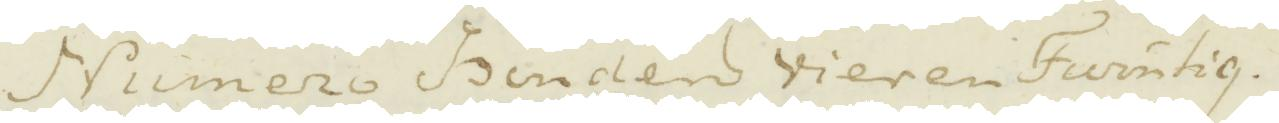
Numero Honderd vier en Twintig.
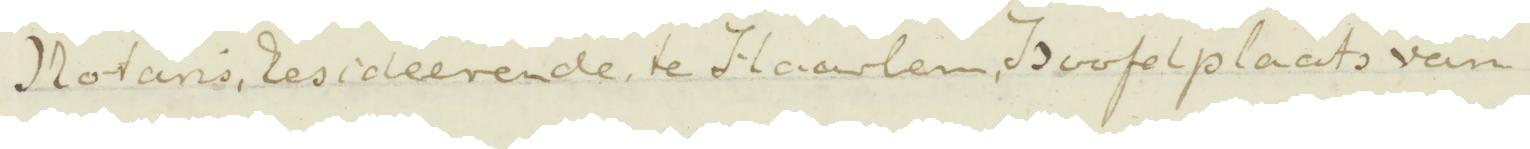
Notaris, resideerende te Haarlem, hoofdplaats van
